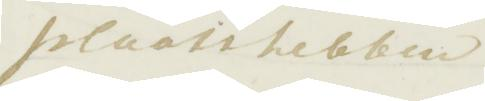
plaats hebben
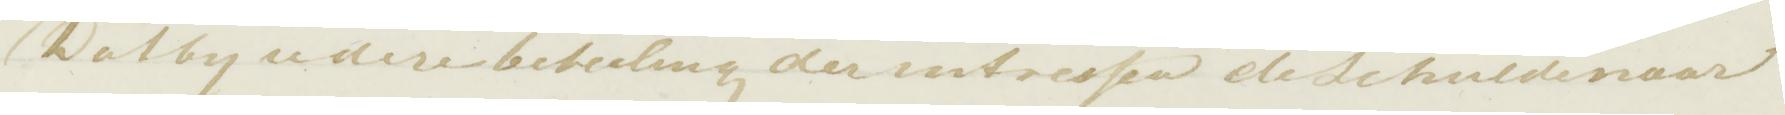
Dat by iedere betaling der intressen de schuldenaar
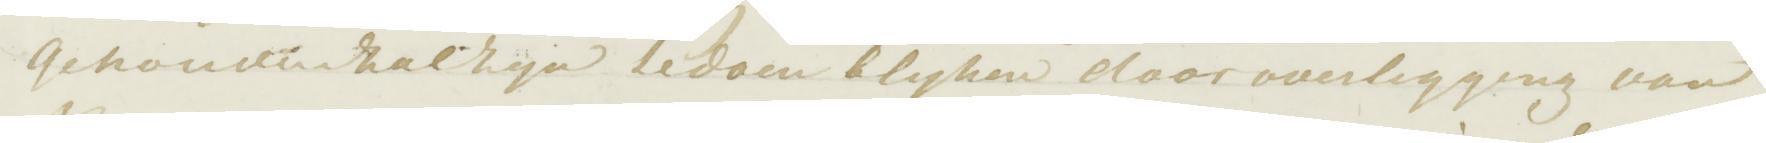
gehouden zal zyn te doen blyken door overlegging van
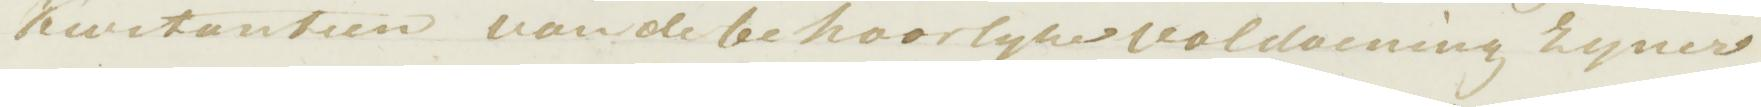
Kwitantien van de behoorlyke voldoening zyner
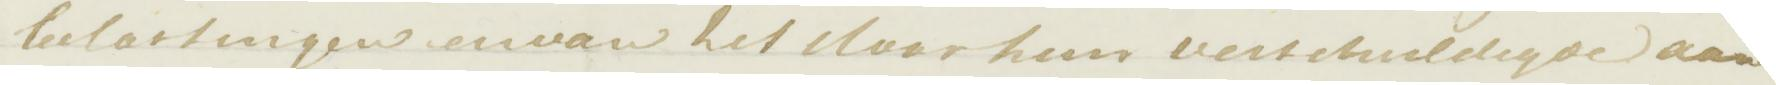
belastingen en van het door hun verschuldigde aan
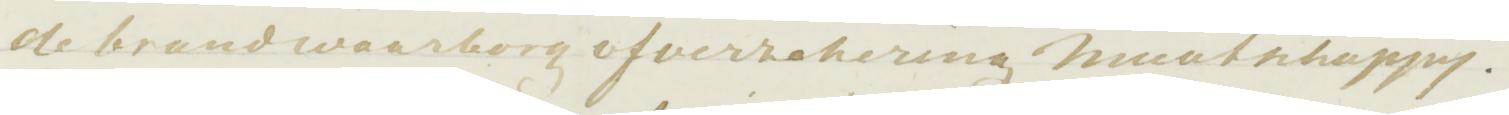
de brandwaarborg of verzekering maatschappy.
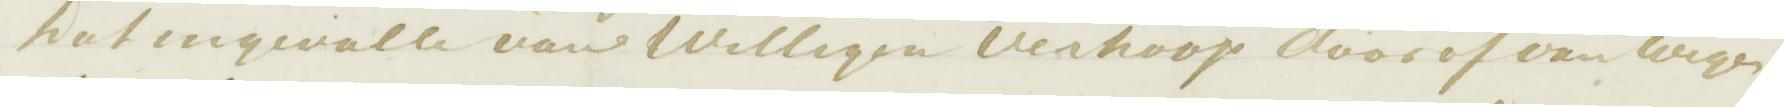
Dat ingevalle van Willigen verkoop door of van wegen
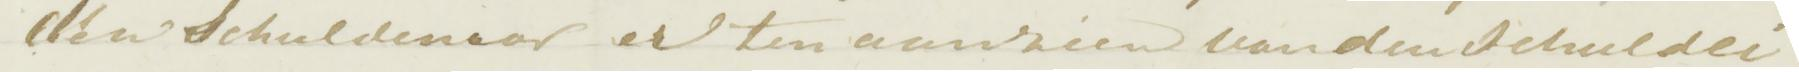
den schuldenaar er ten aanzien van den schuldei
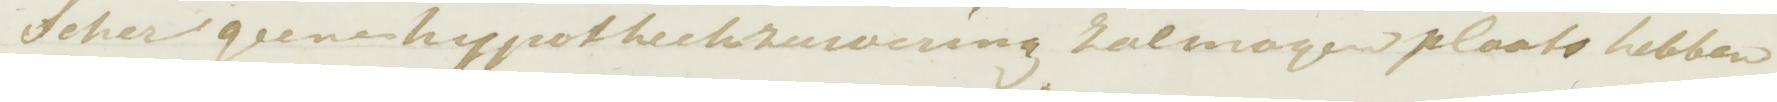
scher geene hypotheek zuivering zal mogen plaats hebben
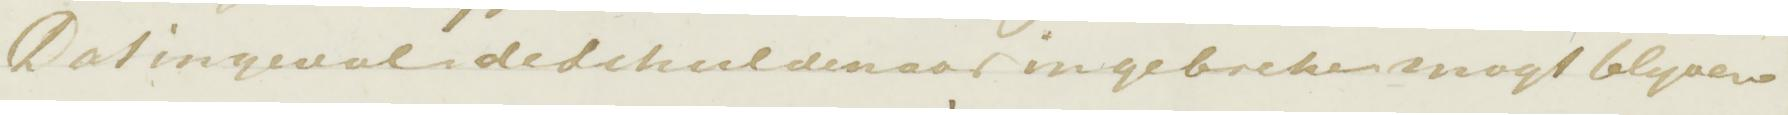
Dat ingeval de schuldenaar in gebreken mogt blyven
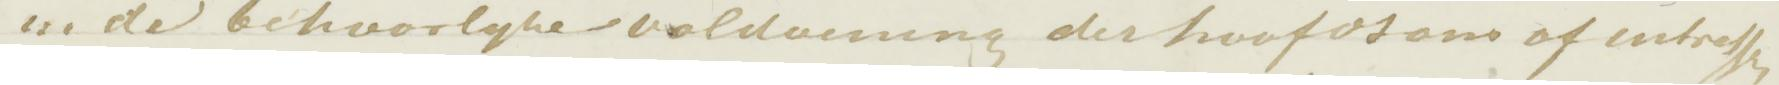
in de behoorlyke voldoening der hoofdsom of intresse
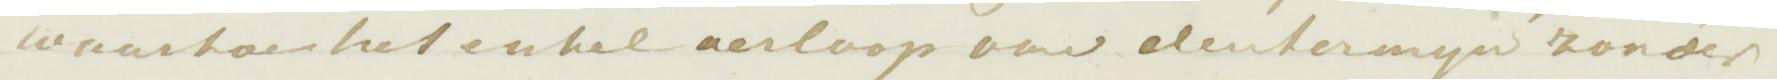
waartoe het enkel verloop van den termyn zonder
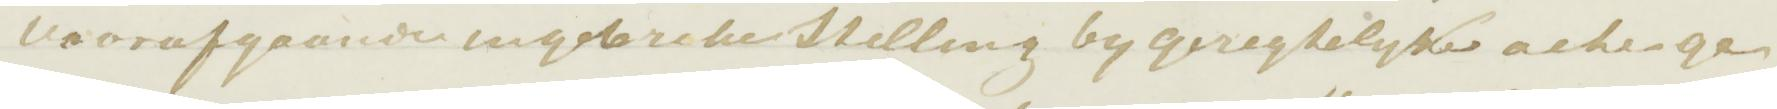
voorafgaande ingebreke stelling by geregtelyke acte ge
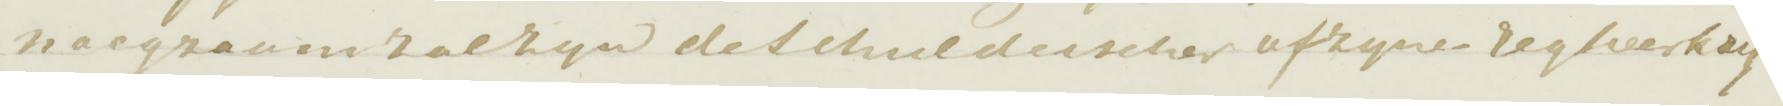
noegzaam zal zyn de schuldeischer of zyne regtverkry
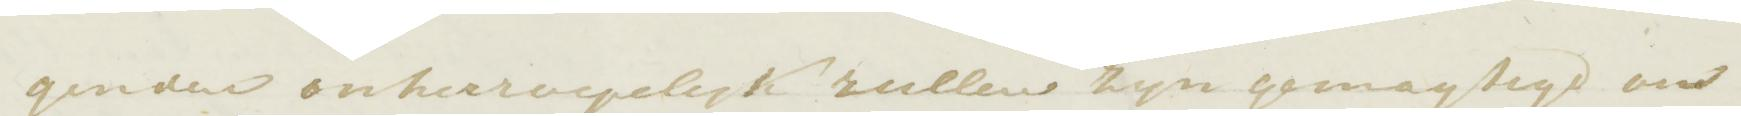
genden onherroepelyk zullen zyn gemagtigd ons
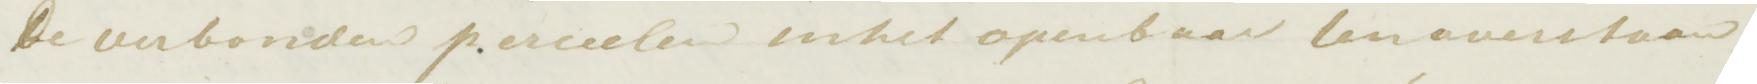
de verbonden perceelen in het openbaar ten overstaan
